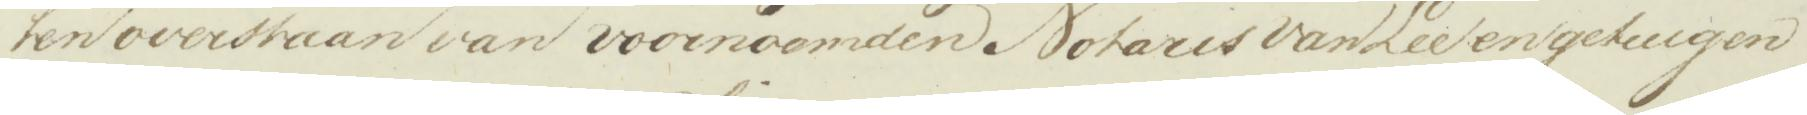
ten overstaan van voornoemden Notaris van Lee en getuigen
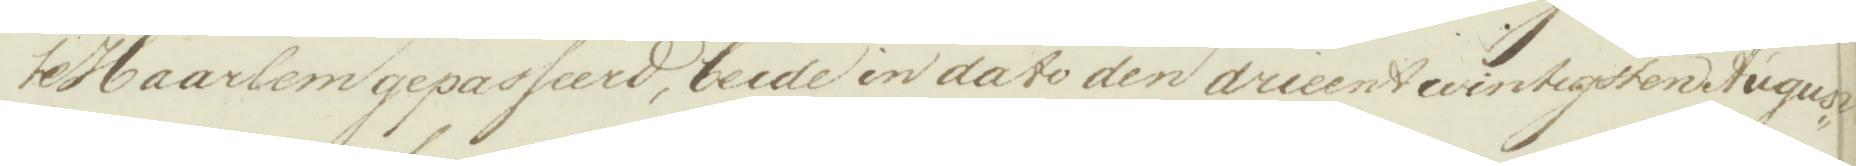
te Haarlem gepasseerd, beide in dato den drieentwintigsten Augus„
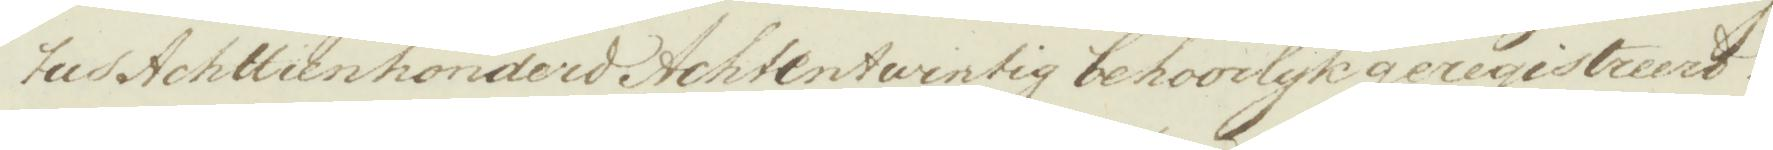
tus Achttienhonderd Achtentwintig behoorlyk geregistreerd.
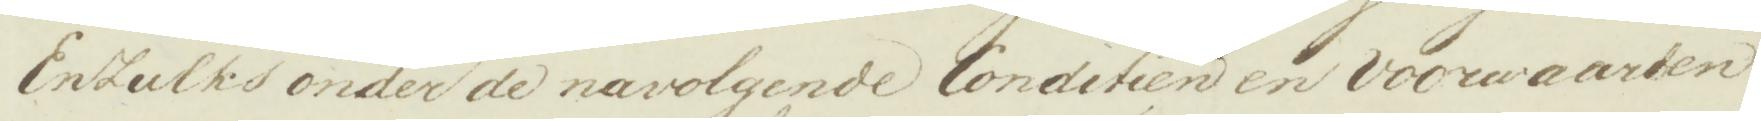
En zulks onder de navolgende Conditien en voorwaarden
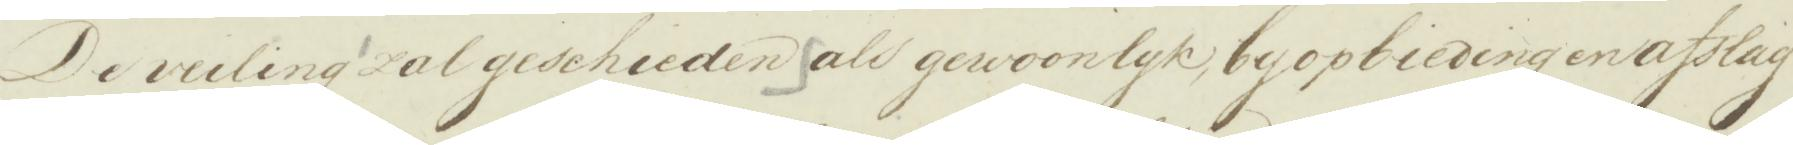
De veiling zal geschieden ] als gewoonlyk, by opbieding en afslag
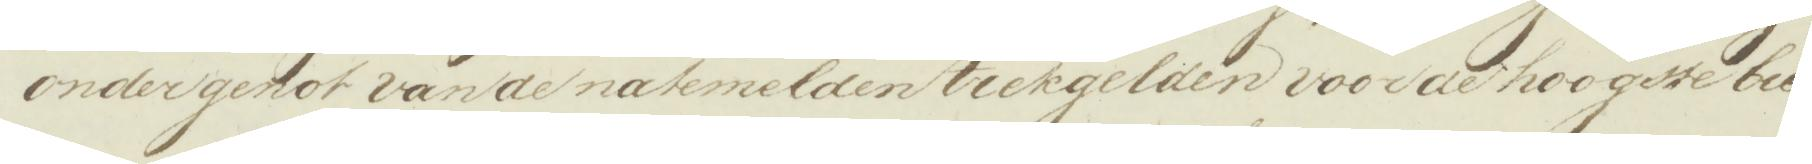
onder gehot van de natemelden trekgelden voor de hoogste bie
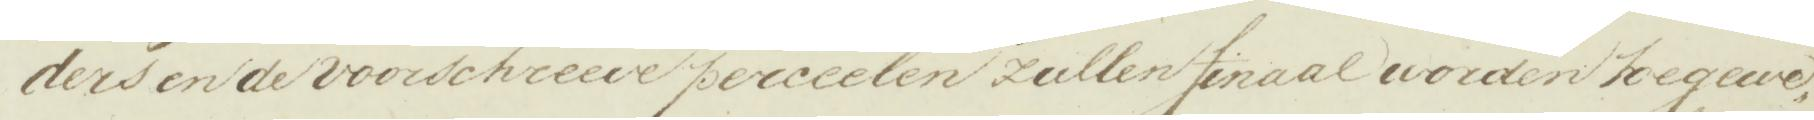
ders en de voorschreeve perceelen zullen finaal worden toegewe„
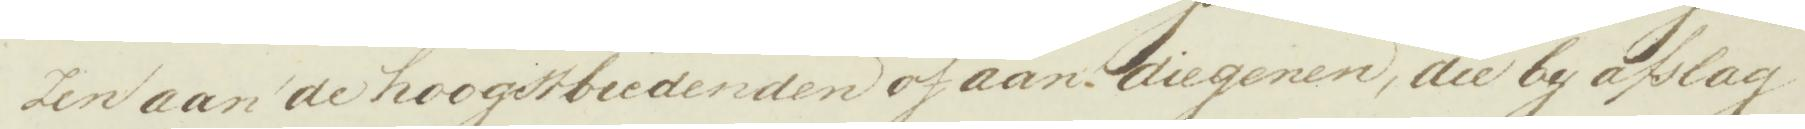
ten aan de hoogstbiedenden of aan diegenen, die by afslag
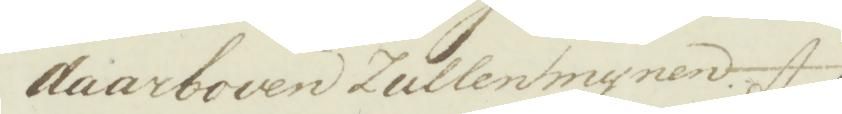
daarboven zullen mynen.
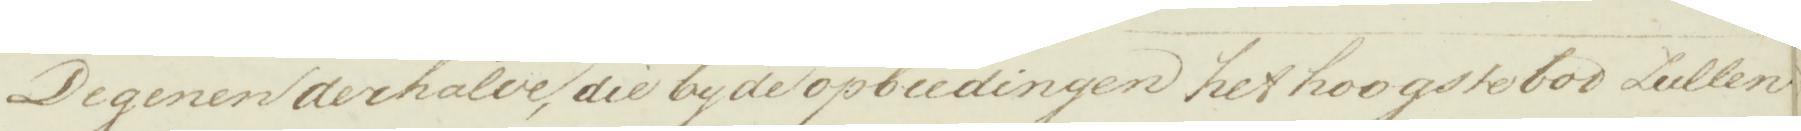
Degenen derhalve, die by de opbiedingen het hoogste bod zullen
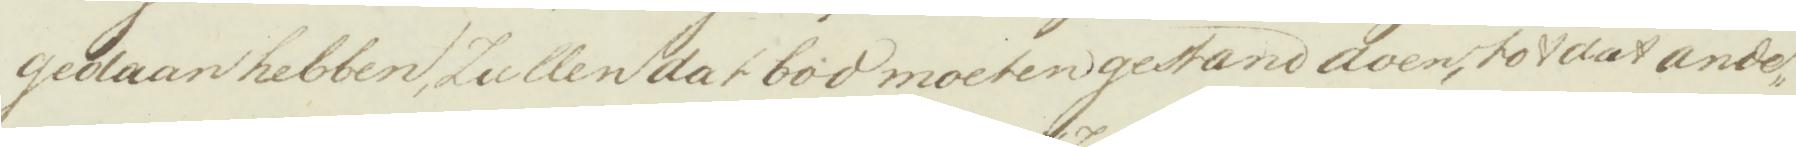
gedaan hebben, zullen dat bod moeten gestand doen, tot dat ande„
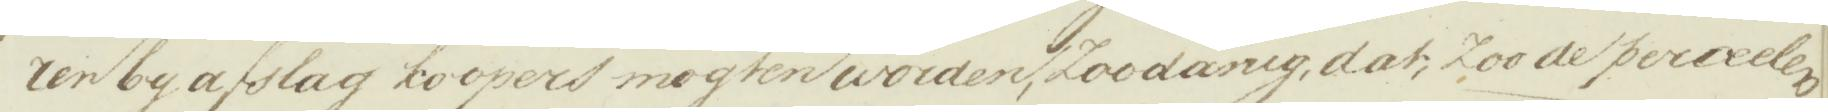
ren by afslag koopers mogten worden, zoodanig, dat, zoo de perceelen
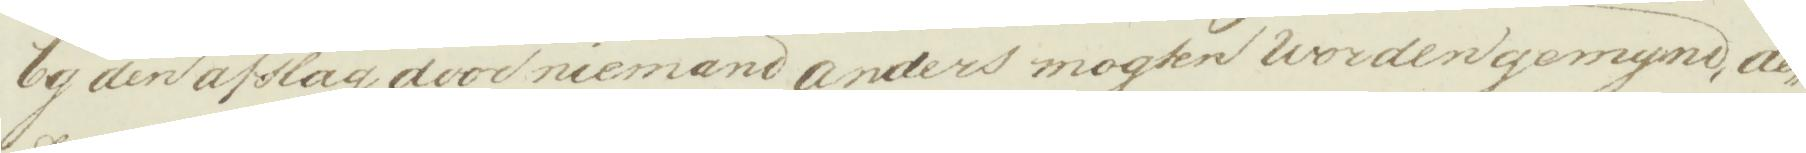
by den afslag, door niemand anders mogten worden gemynd, de„
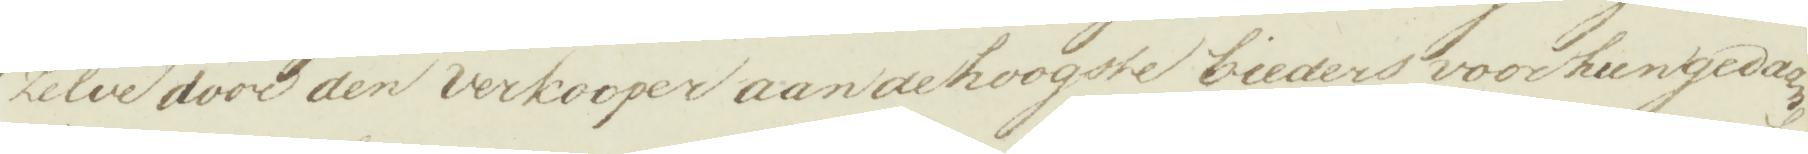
zelve door den verkooper aan de hoogste bieders voor hun gedaan
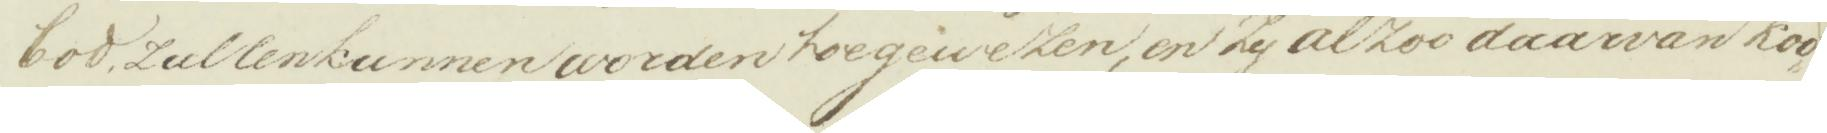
bod, zullen kunnen worden toegewezen, en zy al zoo daarvan koo
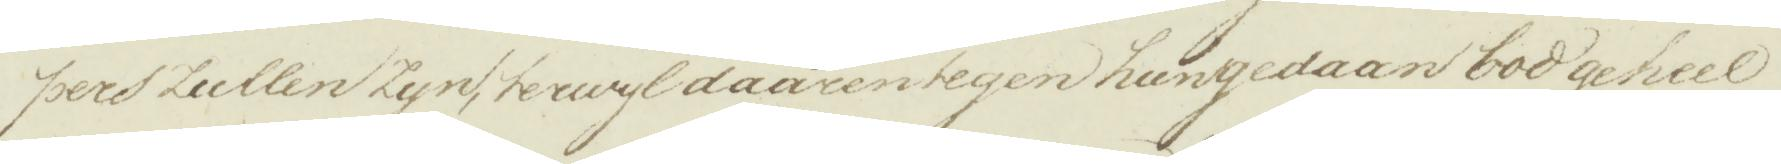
pers zullen zyn, terwyl daarentegen hun gedaan bod geheel
